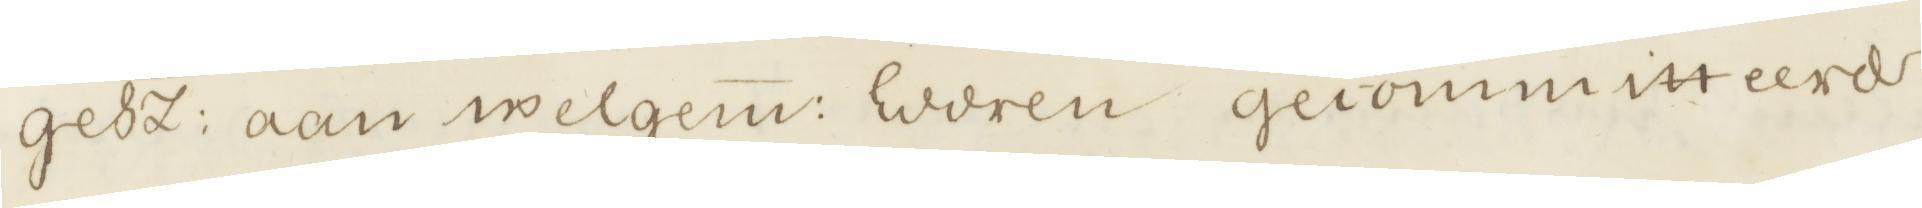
gesz: aan welgem: heeren gecommitteerde
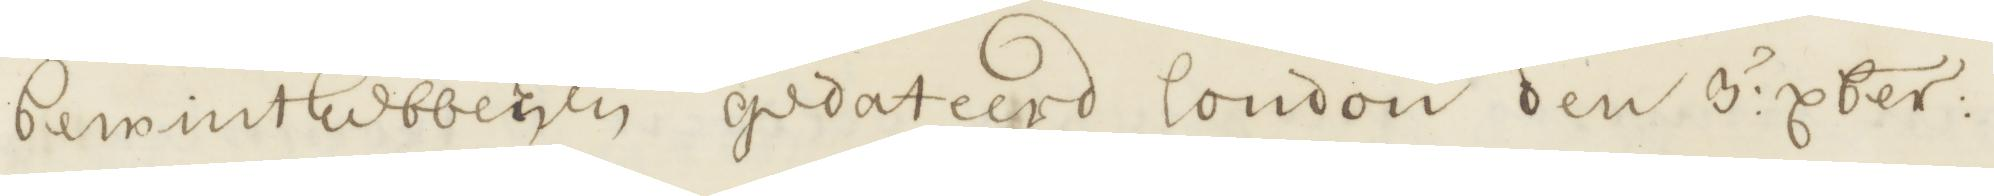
bewinthebber en gedateerd london den 3:' xber:
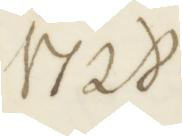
1728
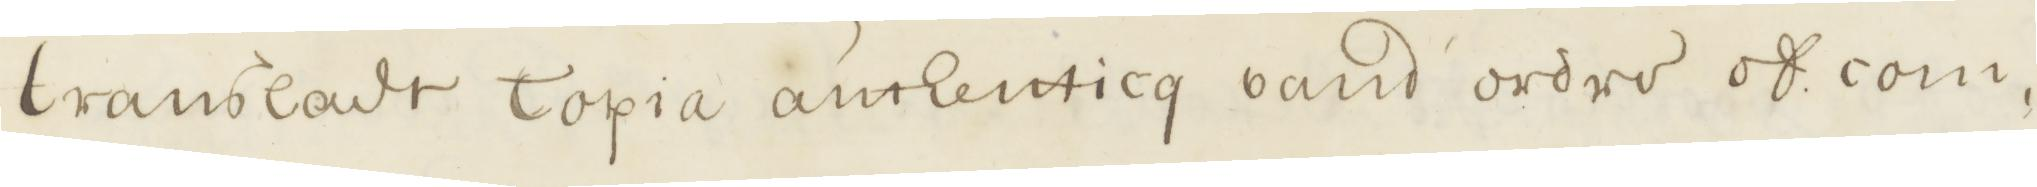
translaet Copia authenticq vand’ ordre of com„
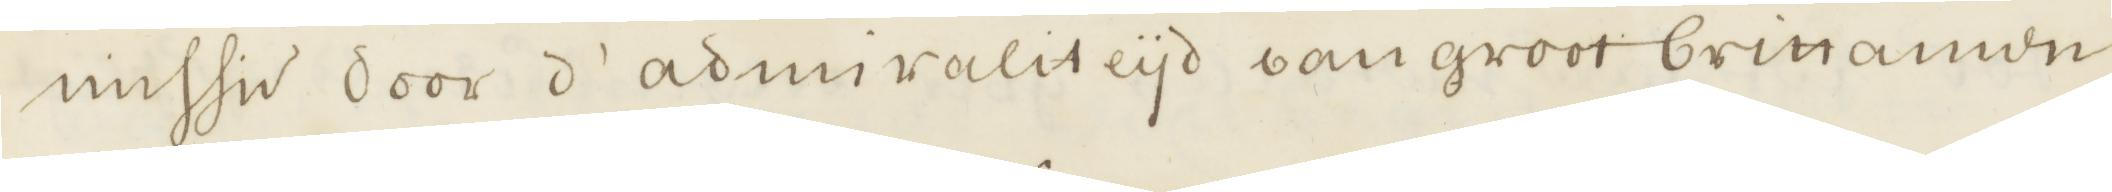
missie door d' admiraliteijd van groot brittanien
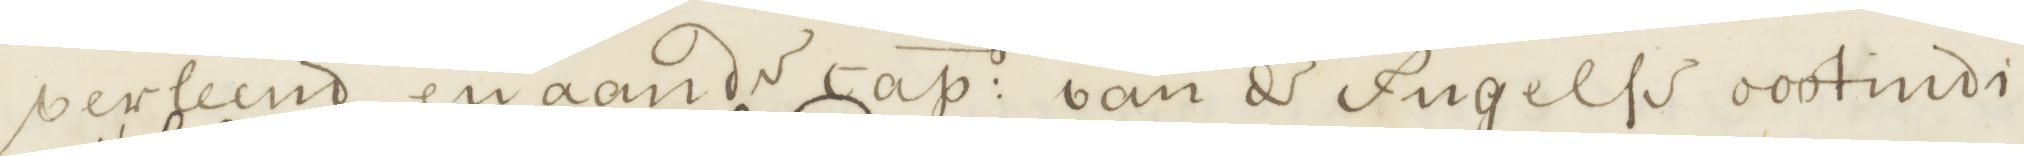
verleend en aan de cap:s van de Engelse oostindi
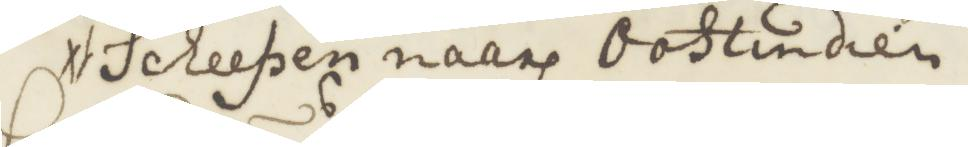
# scheepen naar Oostindien
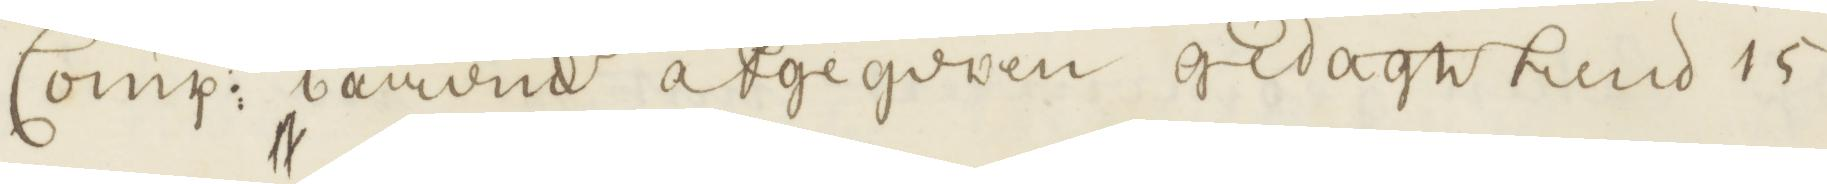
se Comp:s # varende afgegeven gedagtekend 15
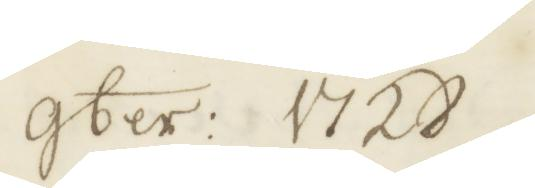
9ber: 1728
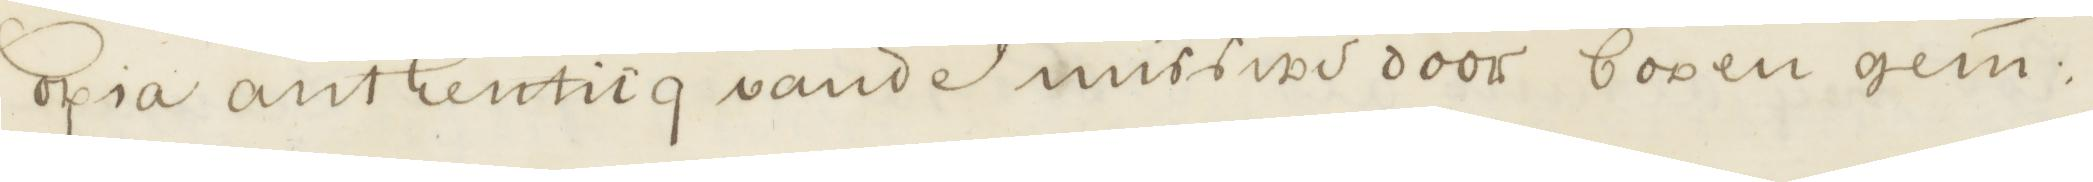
Copia authenticq vande missive door boven gem:
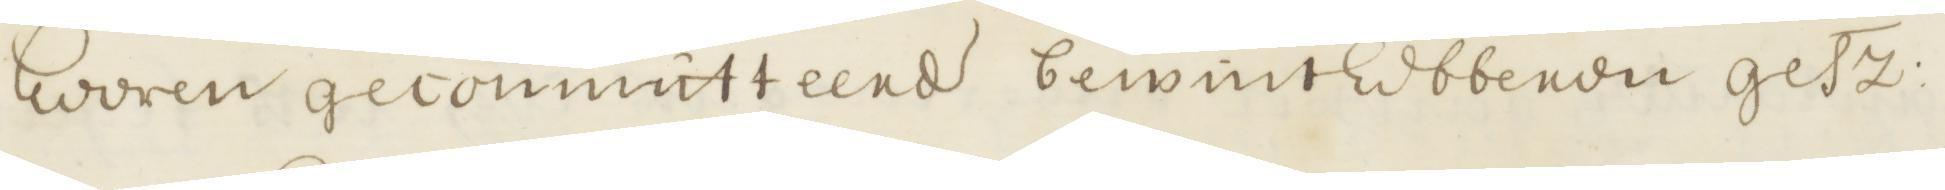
heeren gecomitteerde bewinthebberen gesz:
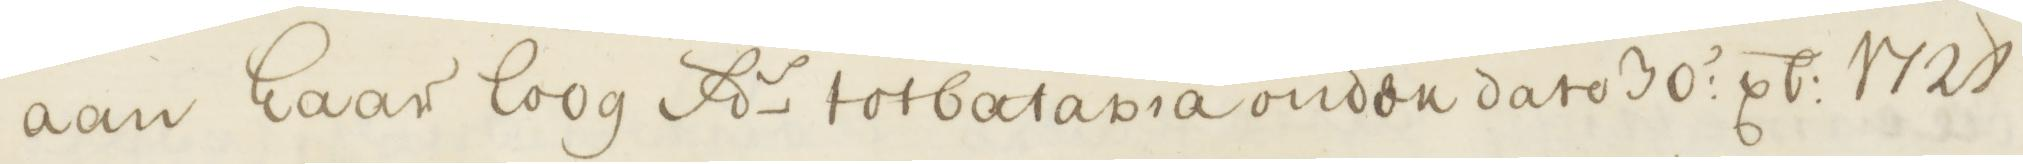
aan haar hoog Ed=s tot batavia onder dato 30:' xb: 1728
